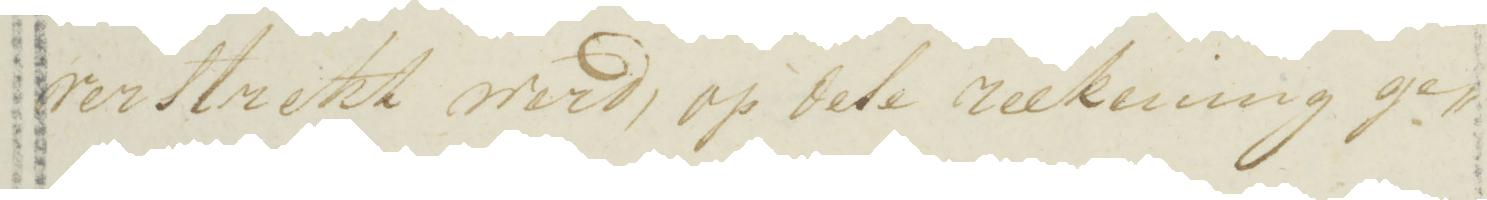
verstrekt werd, op dese reekening ge„
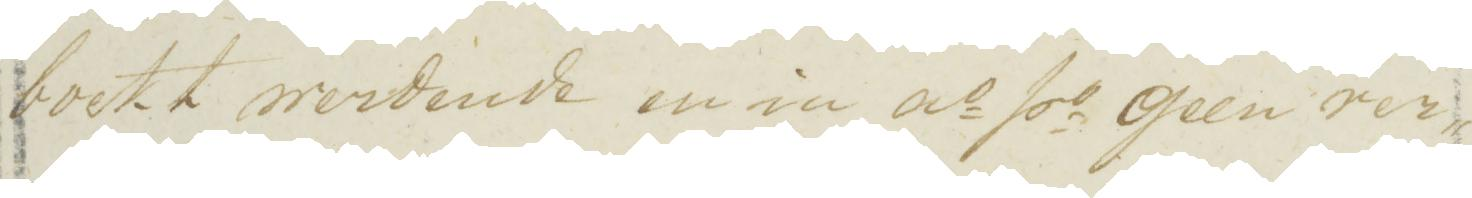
boekt werdende en in a=o p=o geen ver„
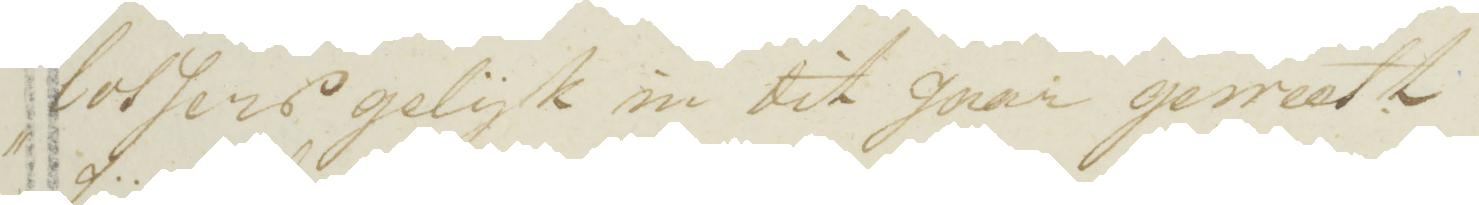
„lossers gelijk in dit jaar geweest
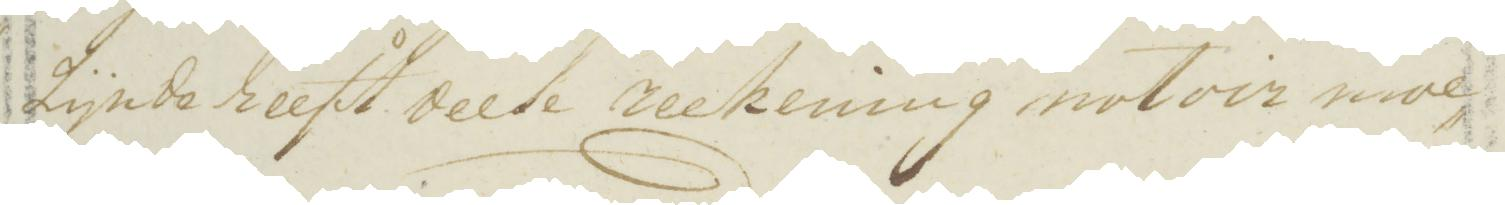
zijnde heeft deese reekening notoir moe„
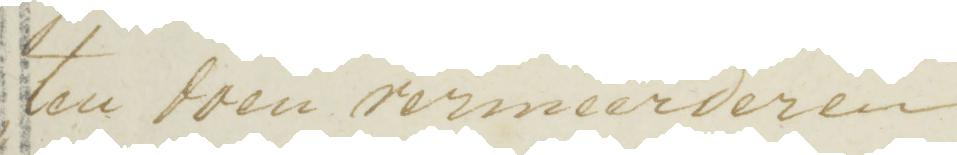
ten doen vermeerderen - -
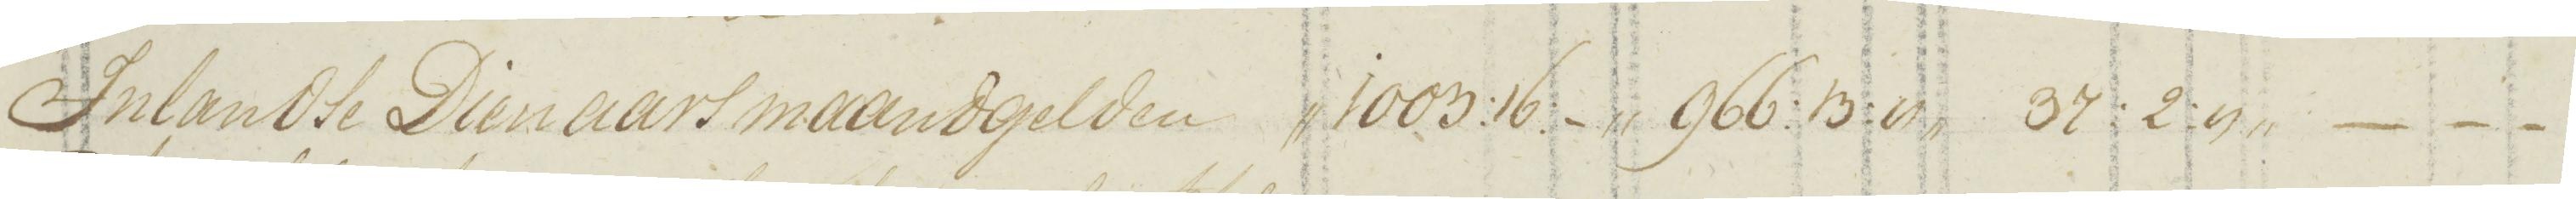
Inlandse Dienaars maandgelden „1003:16:—„ 966:13:8„ 37:2:8„ — — —
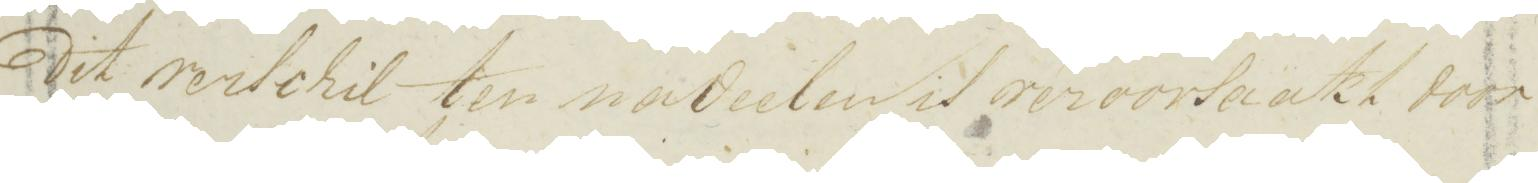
dit verschil ten nadeelen is veroorsaakt door
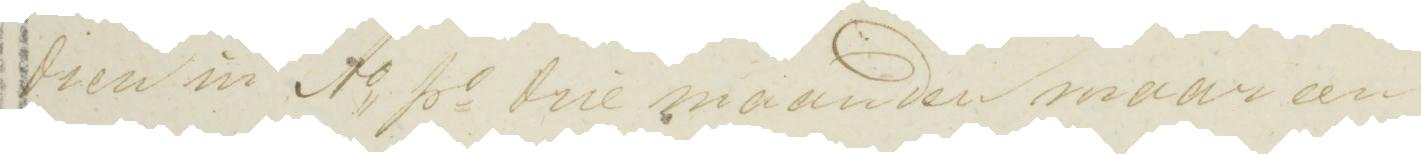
dien in A„o p=o drie maanden maar een
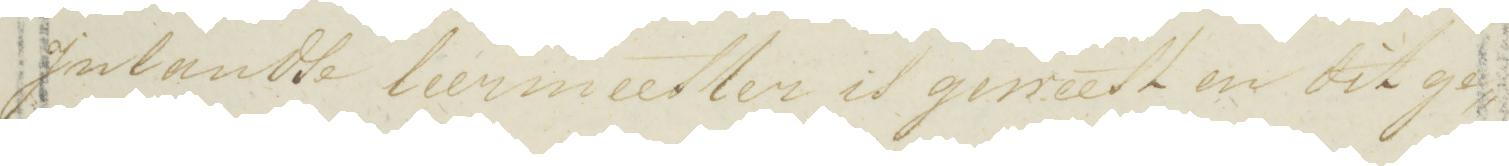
Jnlandse leermeester is geweest en dit ge„
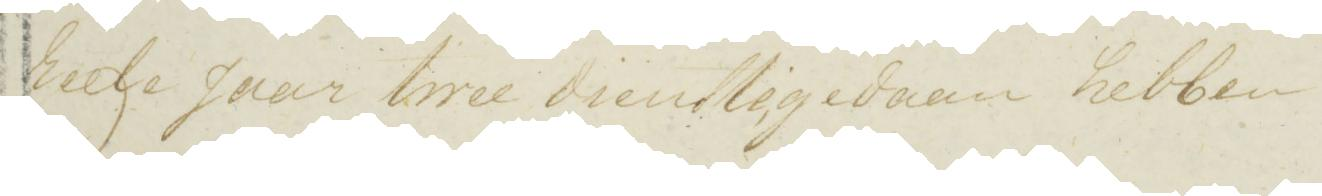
heele jaar twee dienste gedaan hebben
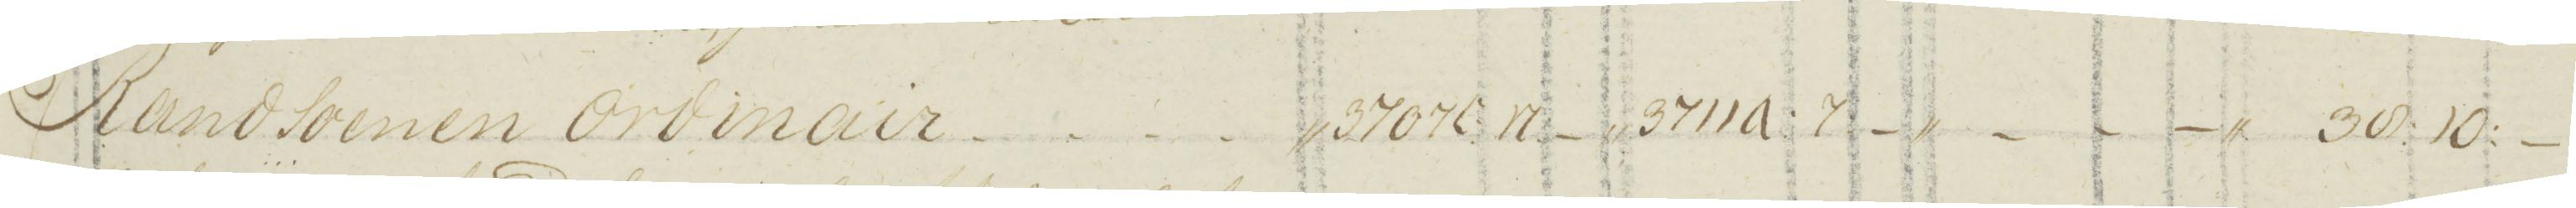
Randsoenen Ordinair - - - - „37075:17:- „ 37114:7:-„ - - - „ 38:10:—
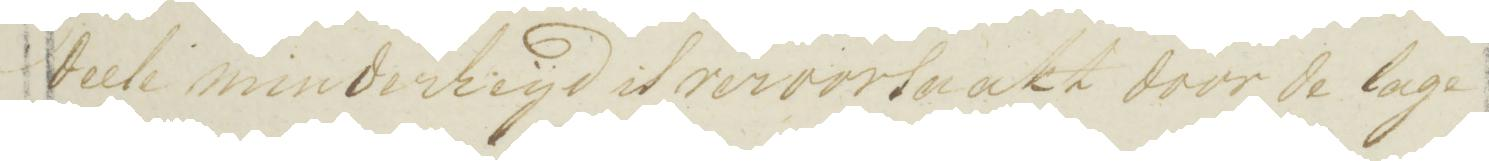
deese minderheijd is veroorsaakt door de lage
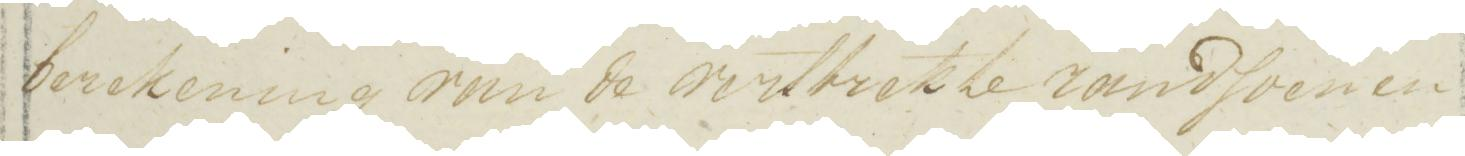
berekening van de verstrekke randsoenen
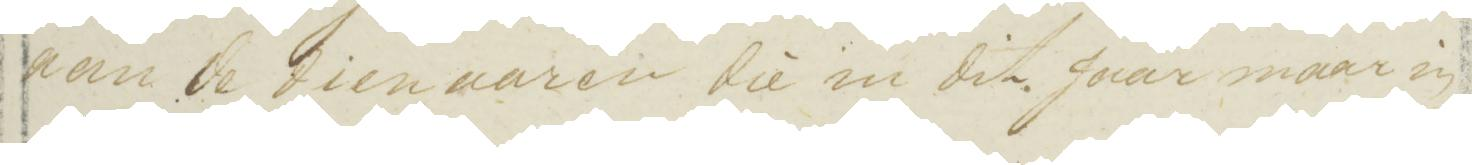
aan de dienaaren die in dit jaar maar in
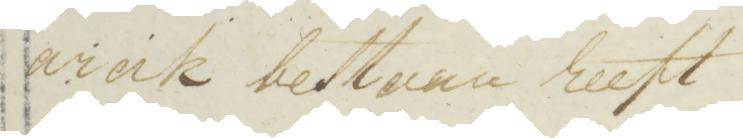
arak bestaan heeft
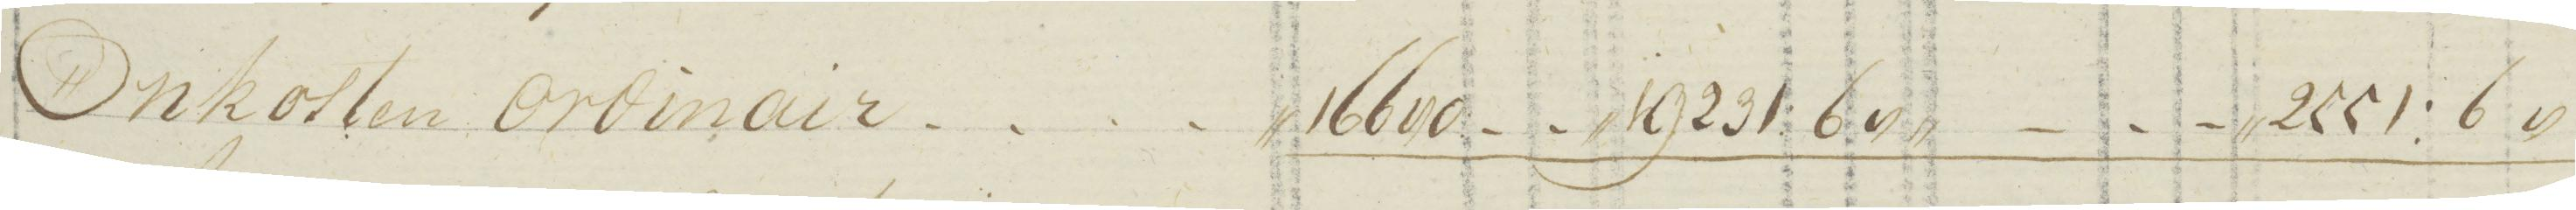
Onkosten Ordinair „16680:- - „19231:6:8:„ - - - „255:6:8
